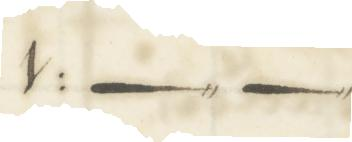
1: —„ —„
